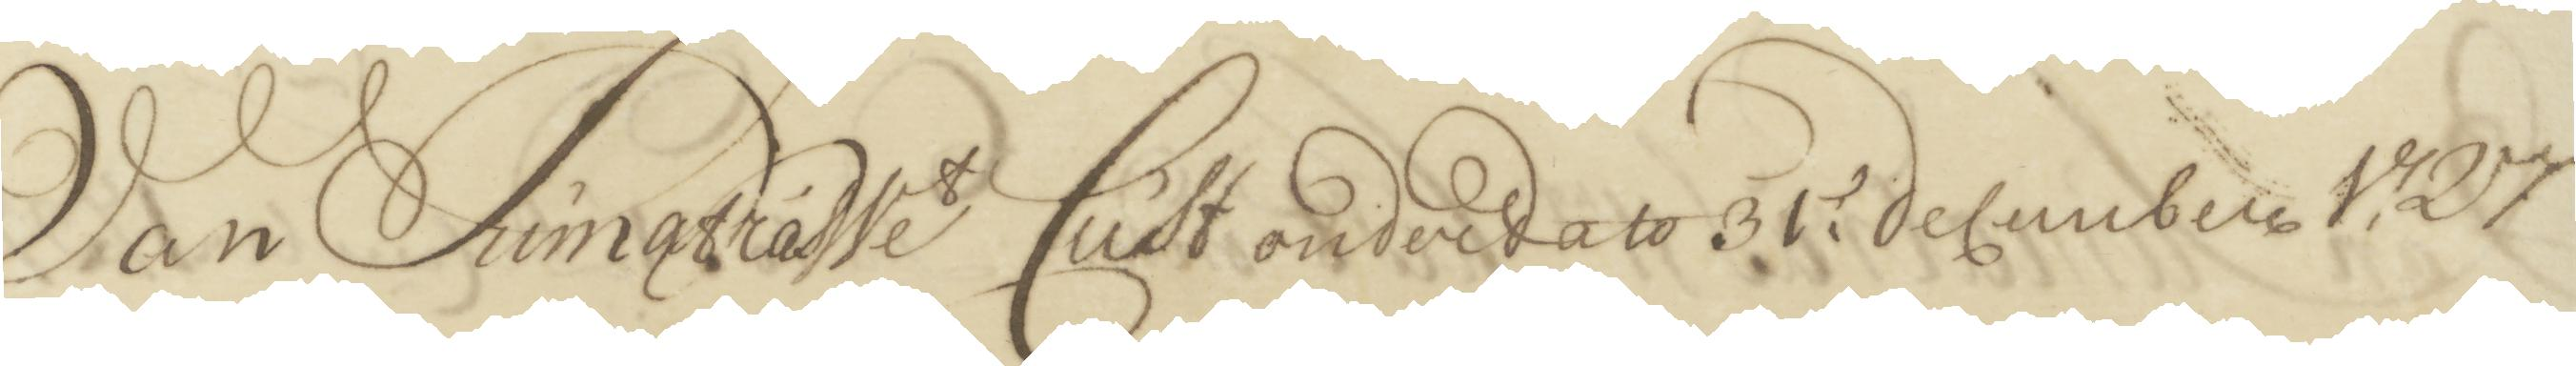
Van Sumatra'sWe:st Cust onderdato 31' december 1727
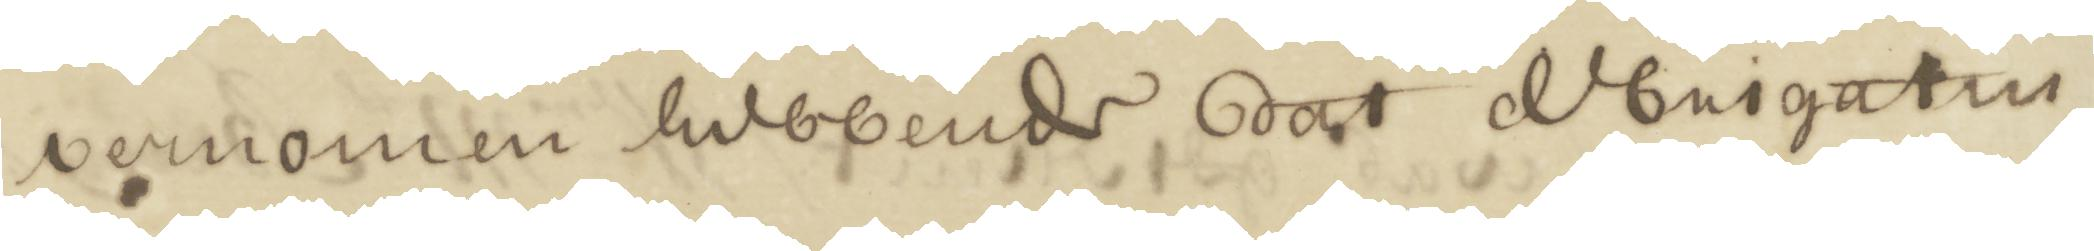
vernomen hebbende, dat debrigatin
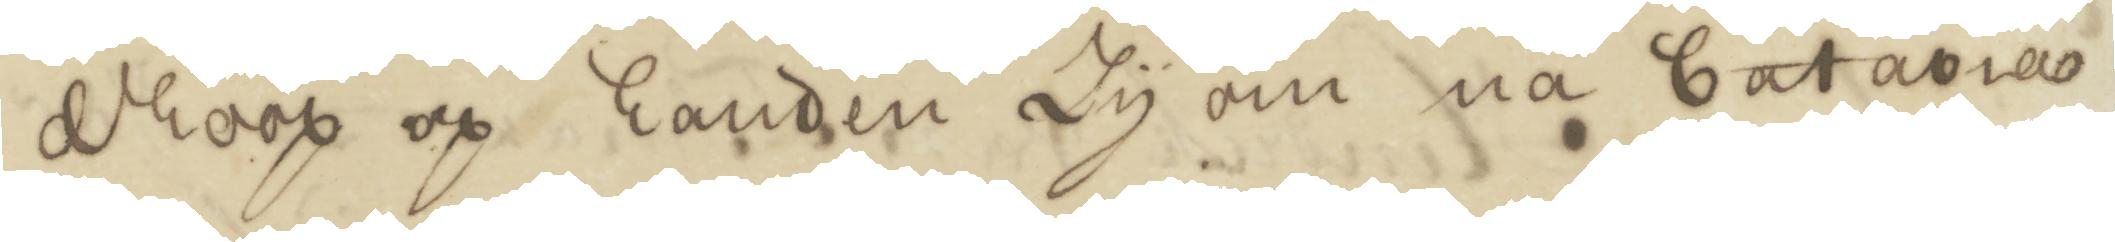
dehoop op handen Zij om na batavia
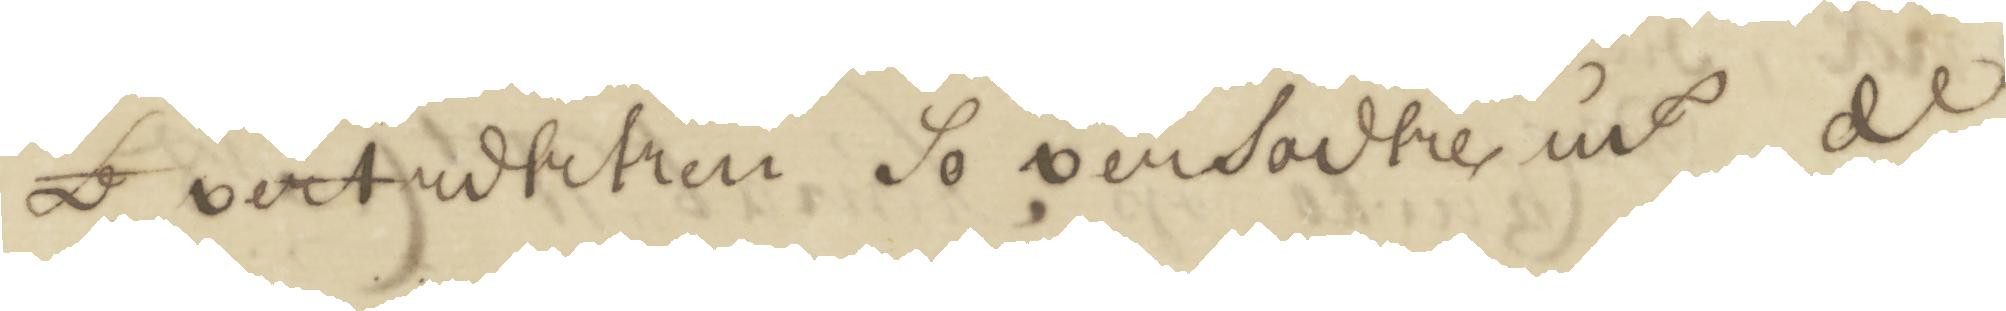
te vertrekken So versoeke uE de
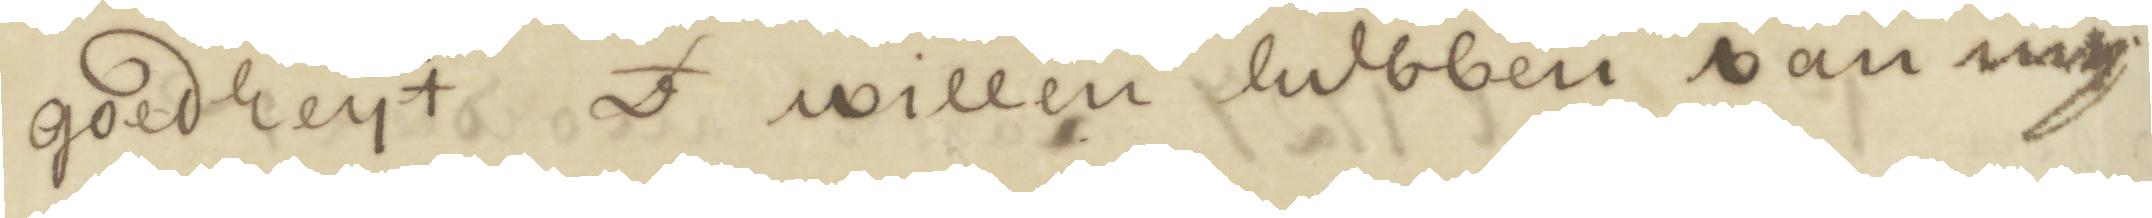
goedheijt te willen hebben van mij
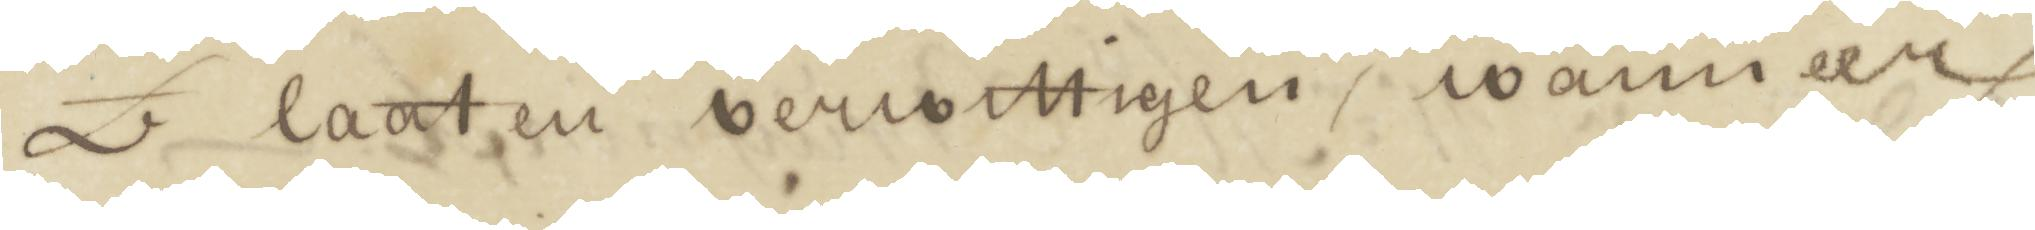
te laaten verwittigen/ wanneer
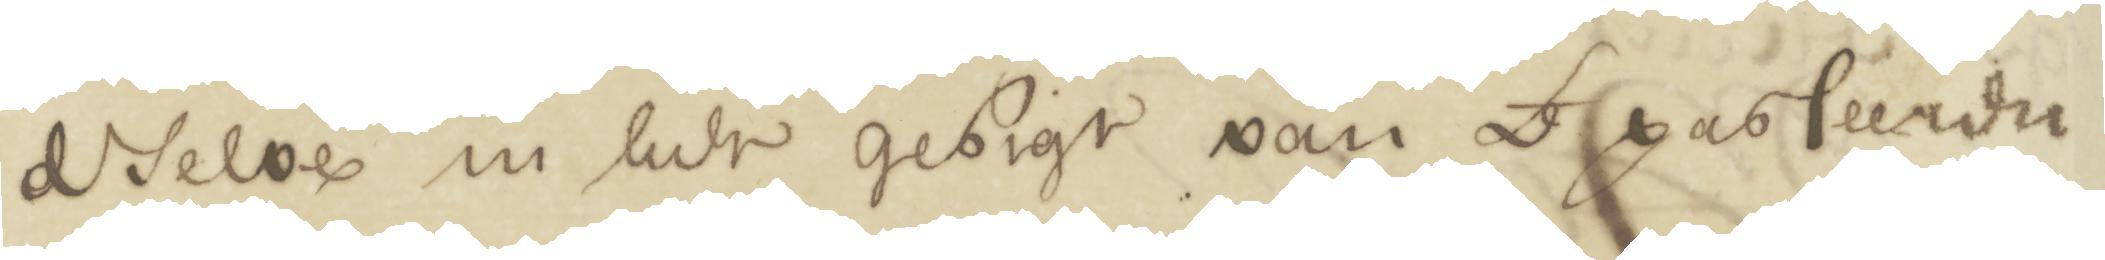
deselve in het gesigt van te passeeren
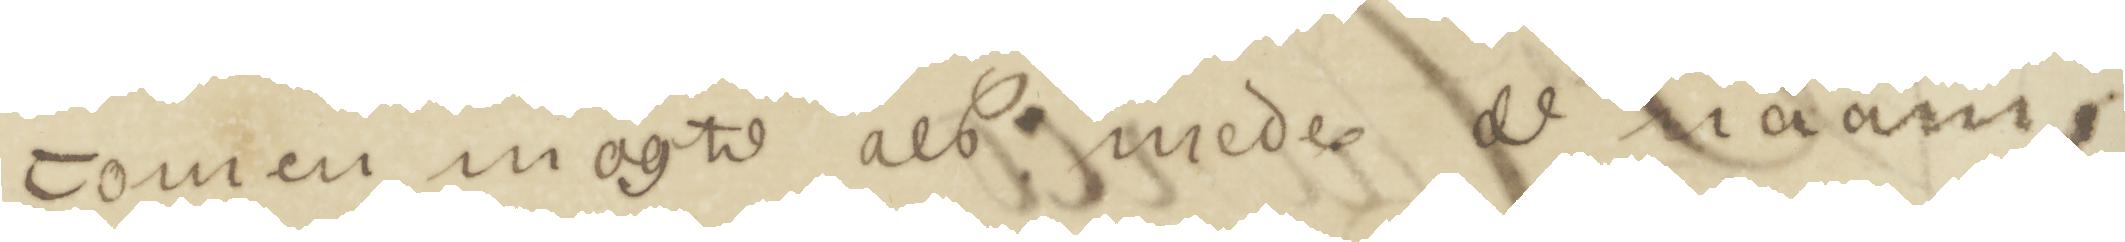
comen mogte als mede de naam
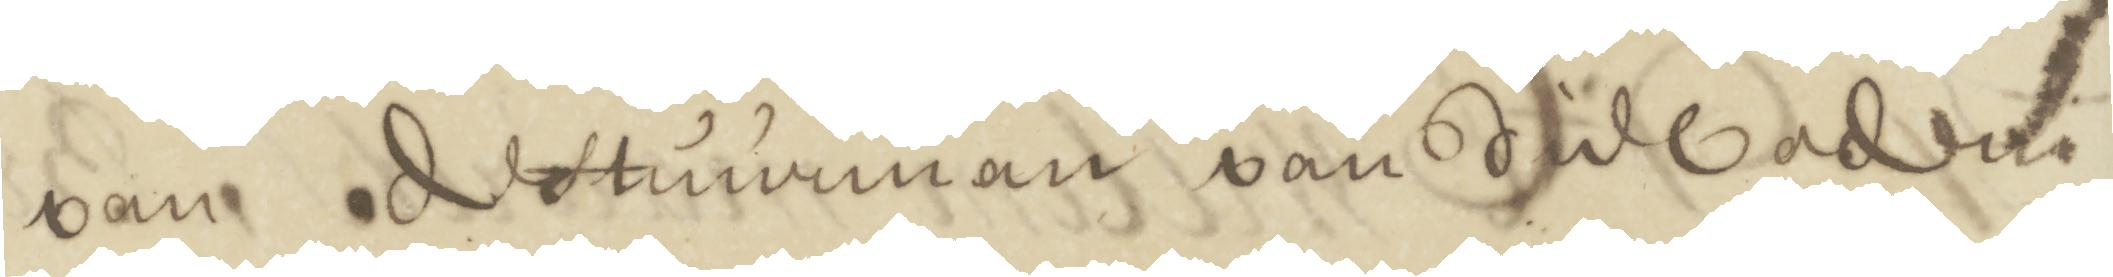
van destuurman van diebodem
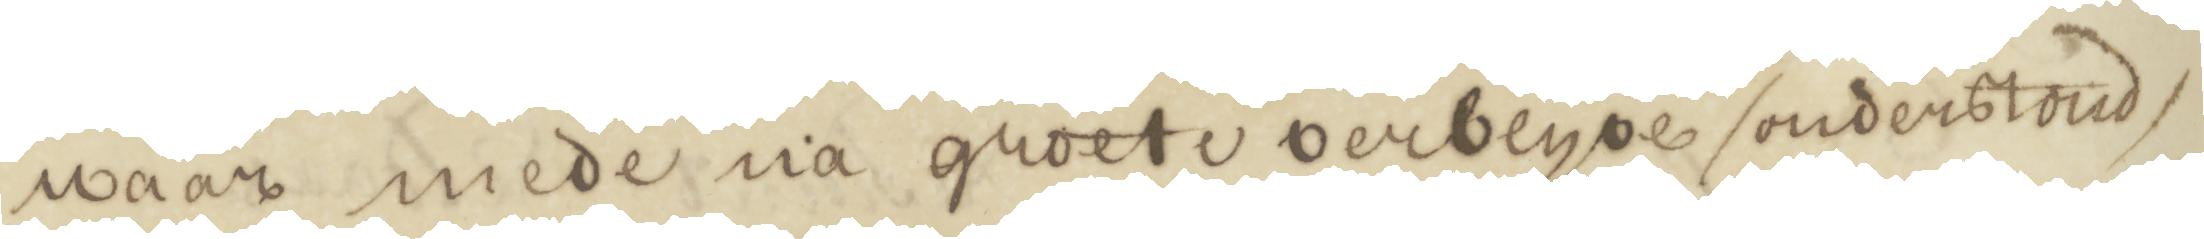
waar mede na groete verblyve /onderstond/
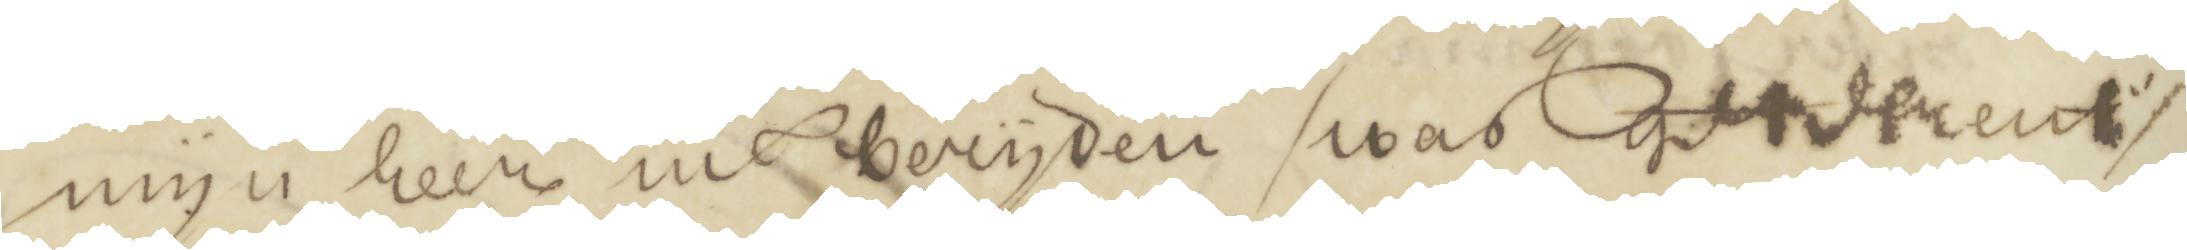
mijn heer uE berijden /was getekent
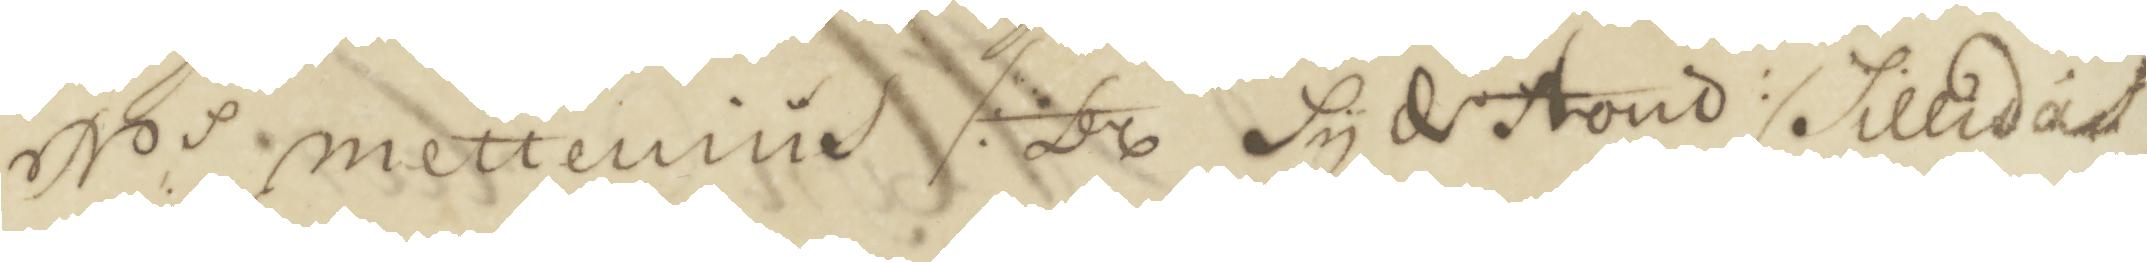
N:s mettenius /: Ter Sij de stond: Sillidas
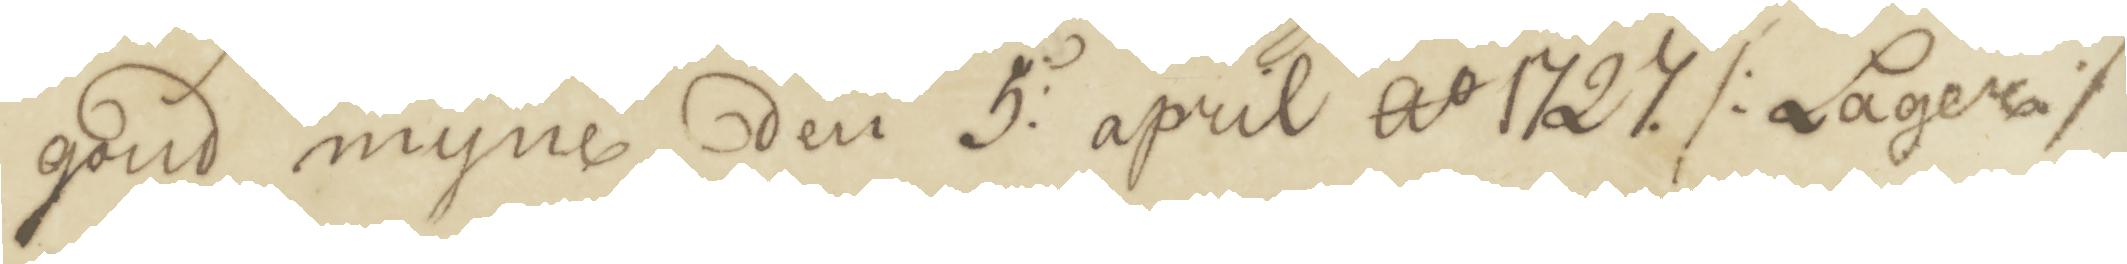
goud myne den 5:' april a:o 1727/: Lager ./.
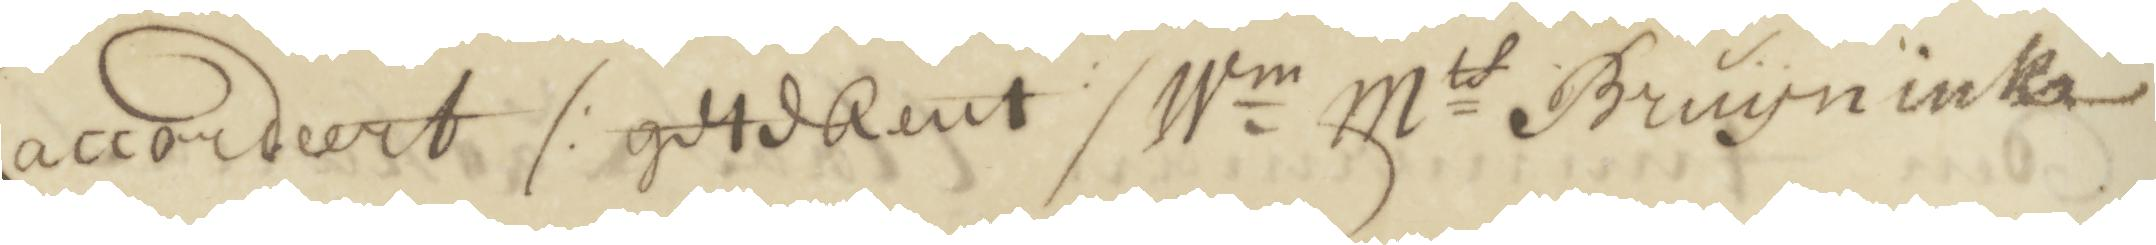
accordeert /: getekent : / W:m M:ts Bruijn in etc
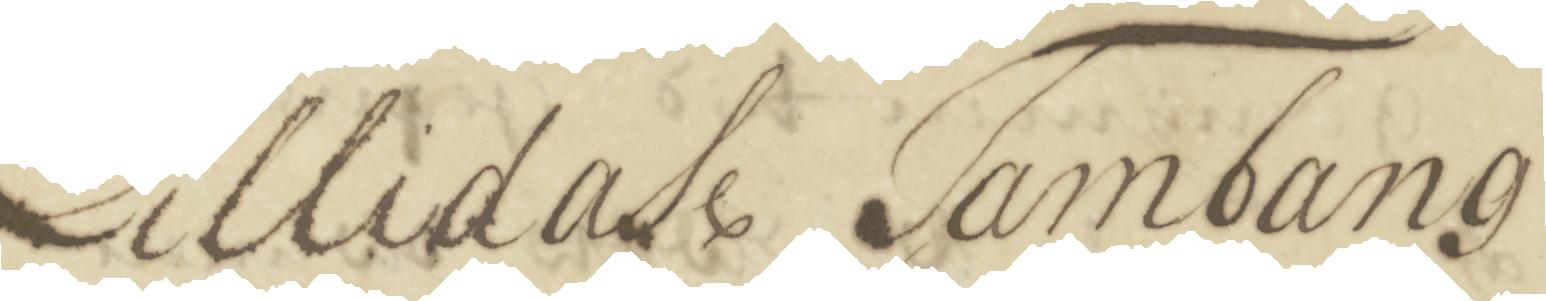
Zillidase Tambang
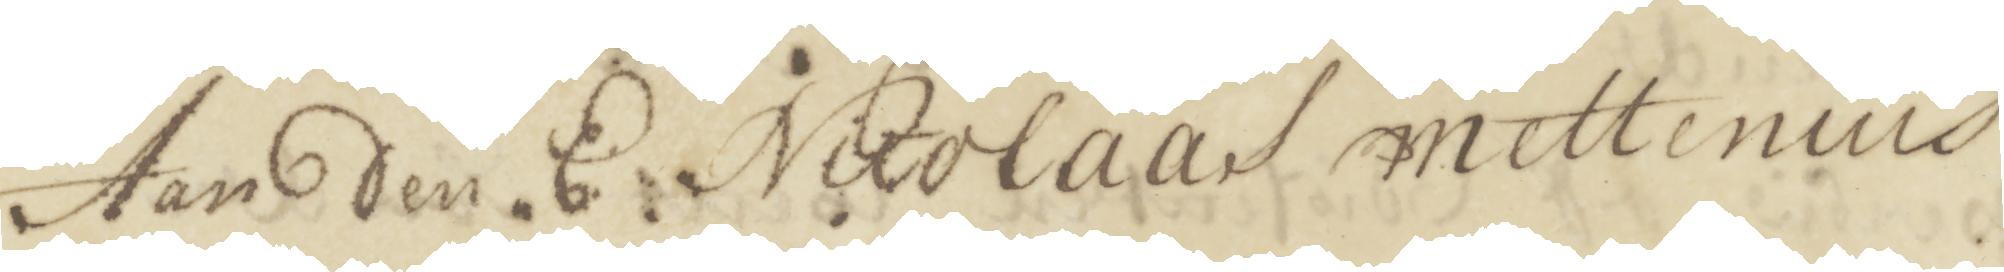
Aan den E Nicolaas mettenius
